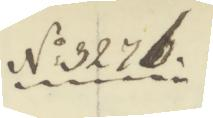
N:o 3276:
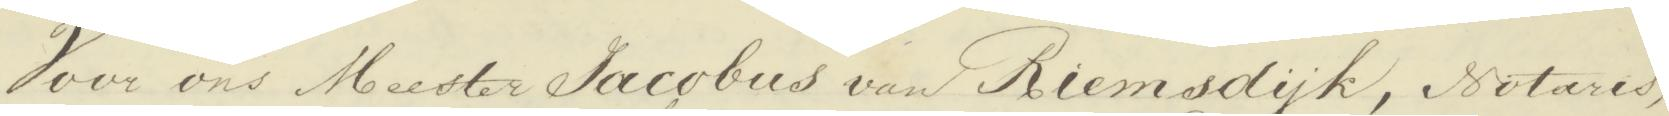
Voor ons Meester Jacobus van Riemsdijk, Notaris,
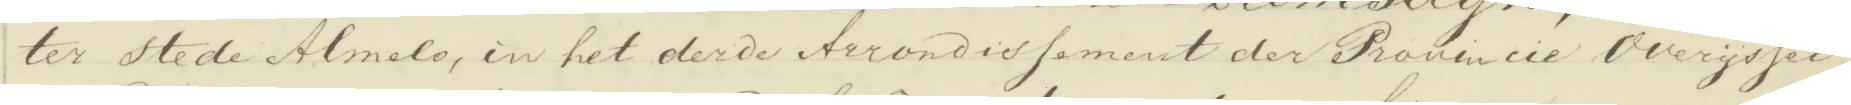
ter stede Almelo, in het derde Arrondissement der Provincie Overijssel
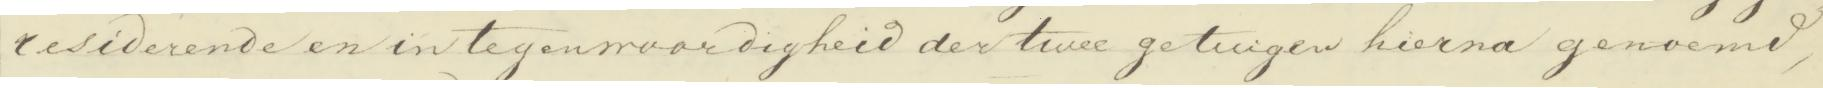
residerende en in tegenwoordigheid der twee getuigen hierna genoemd,
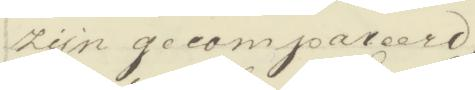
zijn gecompareerd
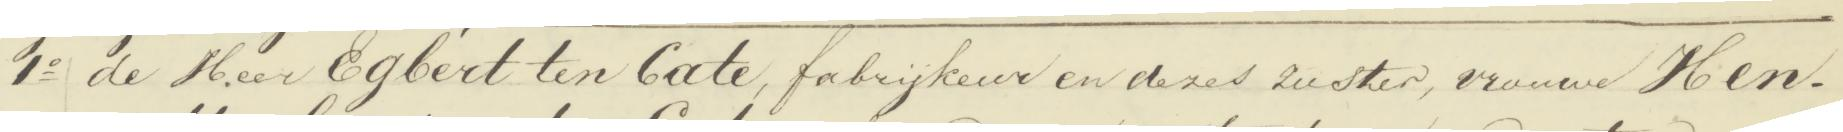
1=o de Heer Egbert ten Cate, fabrijkeur en dezes zuster, vrouwe Hen„
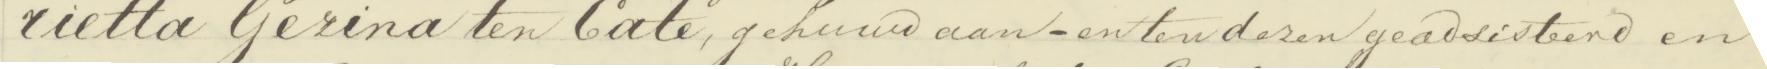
rietta Gezina ten Cate, gehuwd aan - en ten dezen geadsisteerd en
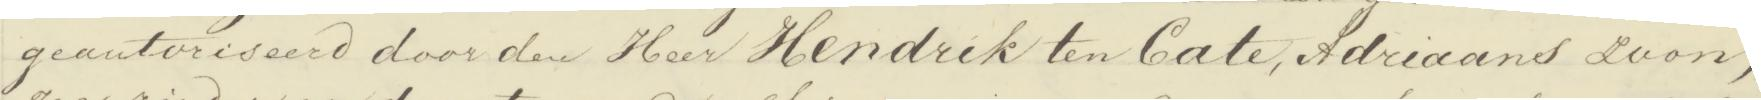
geautoriseerd door den Heer Hendrik ten Cate, Adriaans zoon,
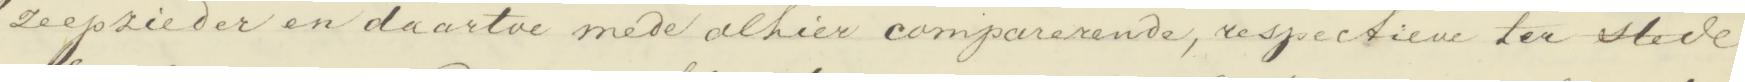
zeepzieder en daartoe mede alhier comparerende, respectieve ter stede
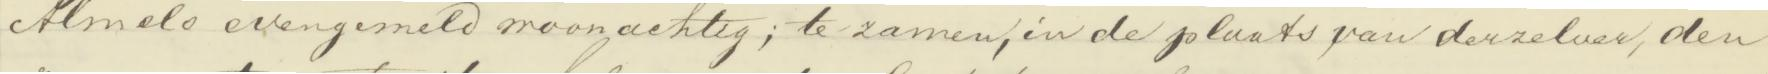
Almelo evengemeld woonachtig; te zamen, in de plaats van derzelver, den
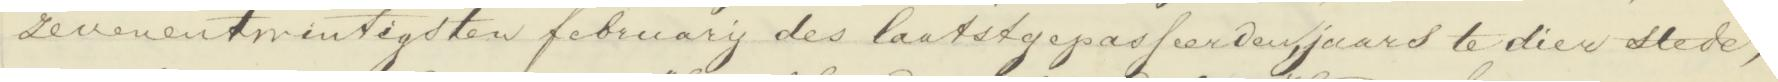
zevenentwintigsten februarij des laatstgepasseerden, jaars te dier stede,
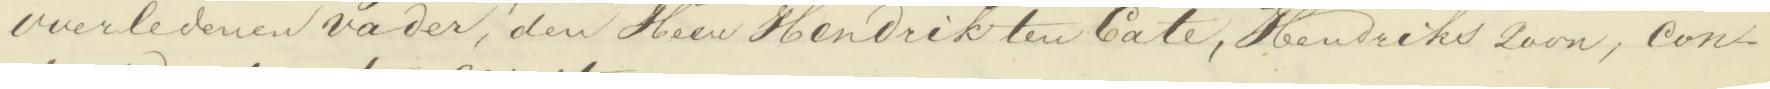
overledenen vader, den Heer Hendrik ten Cate, Hendriks zoon, con„
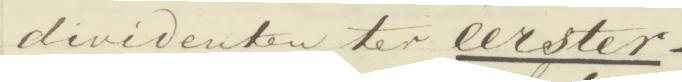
dividenten ter eerster.
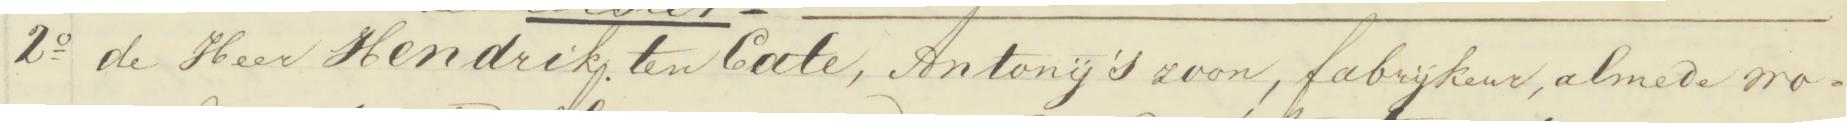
2=o de Heer Hendrik ten Cate, Antonij 's zoon, fabrijkeur, almede wo„
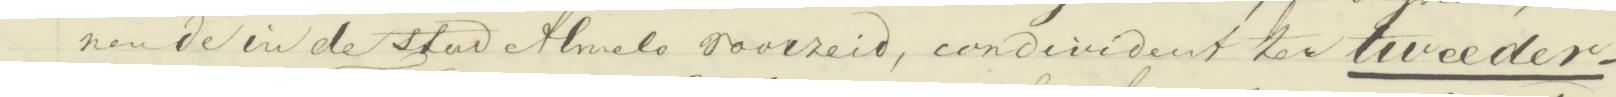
nende in de stad Almelo voorzeid, condivident ten tweeder
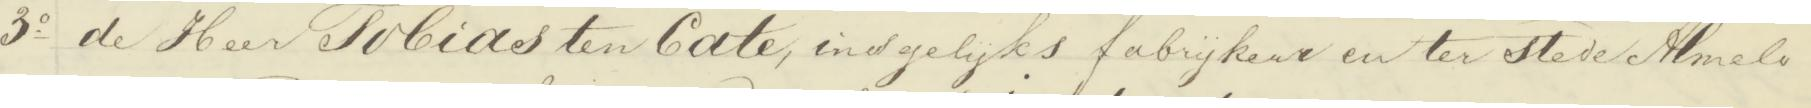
3=o de Heer Tobias ten Cate, insgelijks fabrijkeur en ter stede Almelo
